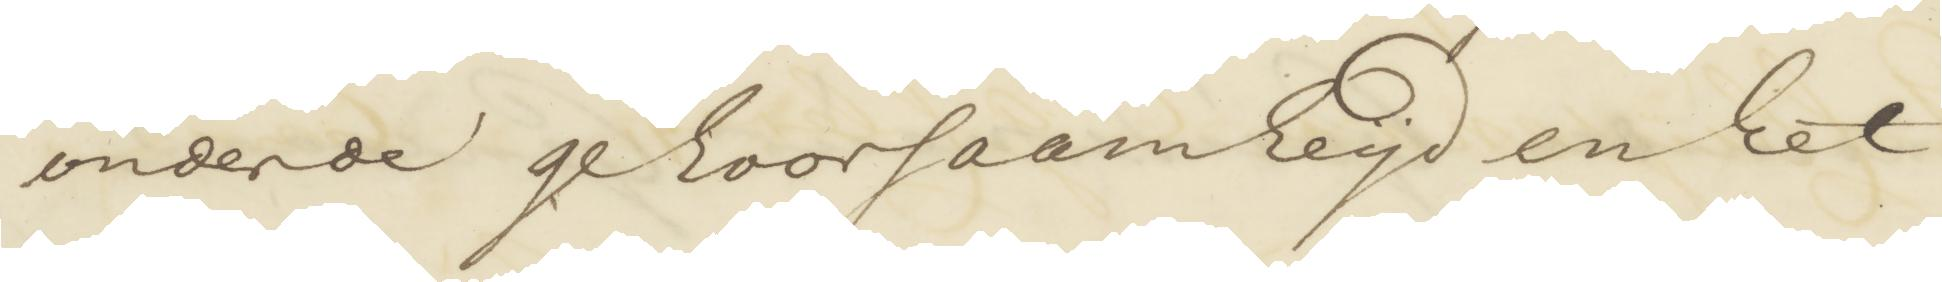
onderde gehoorsaamheijd en het
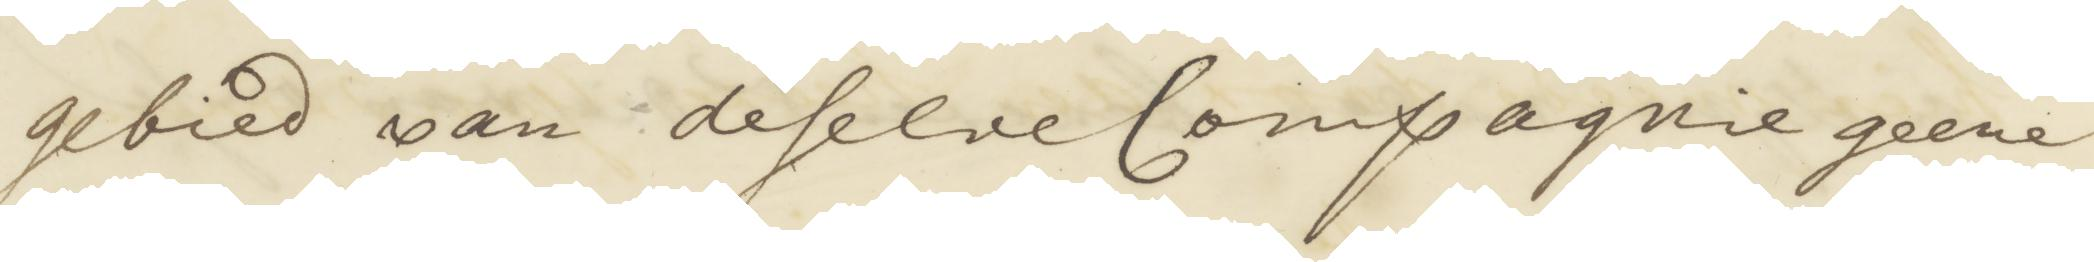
gebied van deselve Compagnie geene
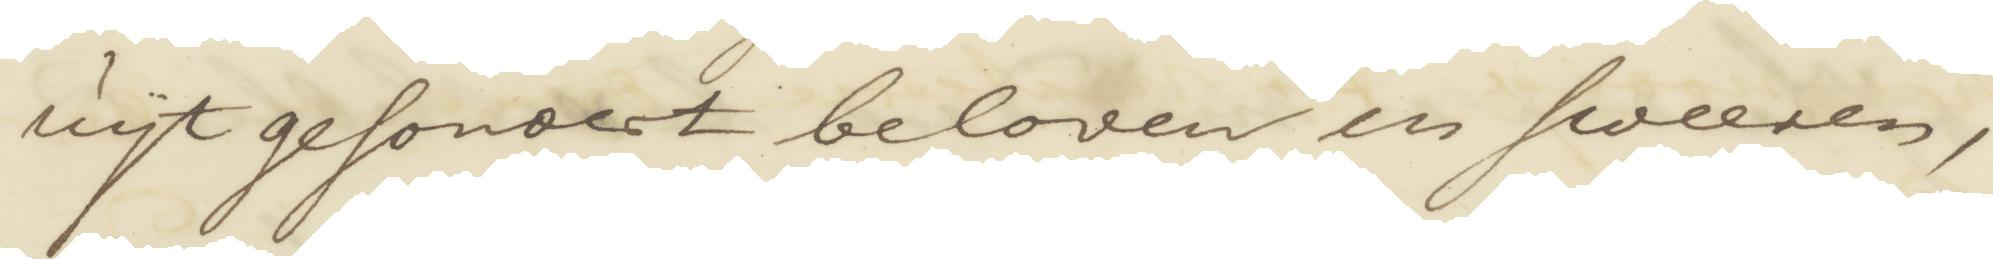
uijt gesondert beloven en sweeren,
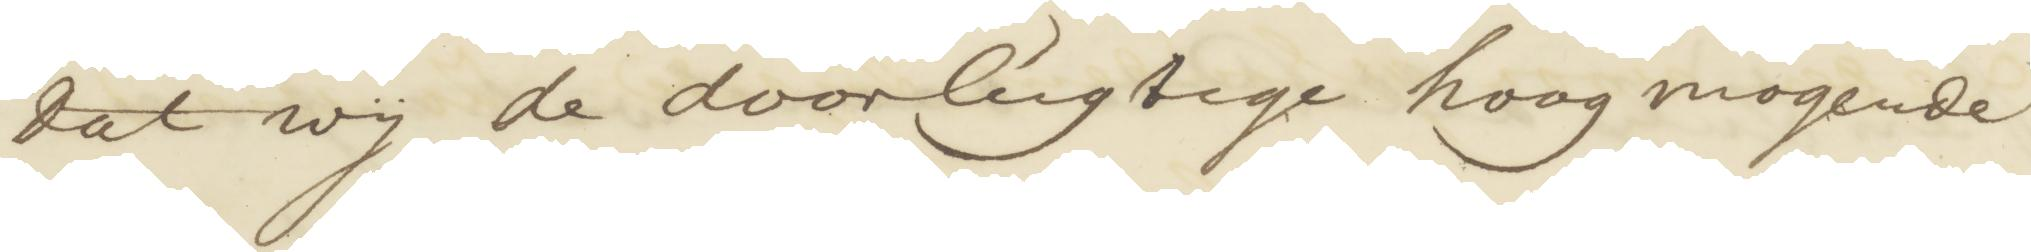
dat wij de doorlugtige hoog mogende
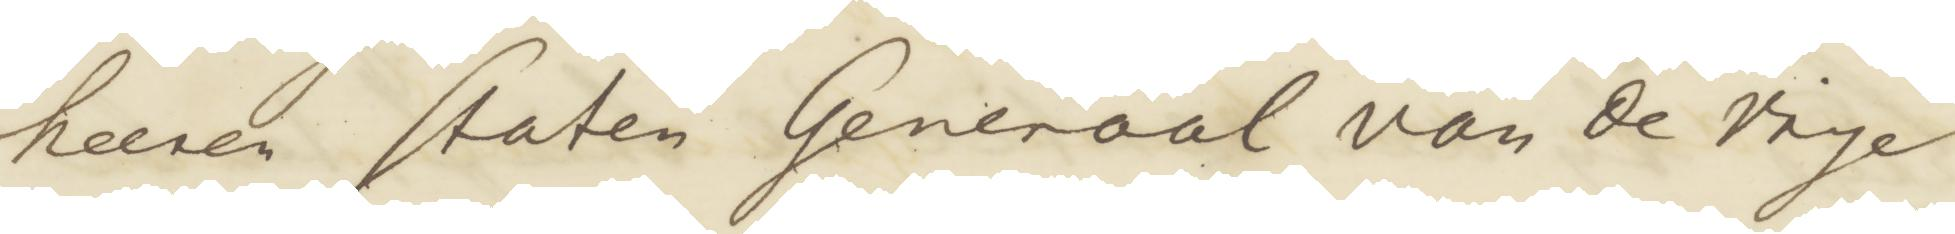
heeren Staten Generaal van de Vrije
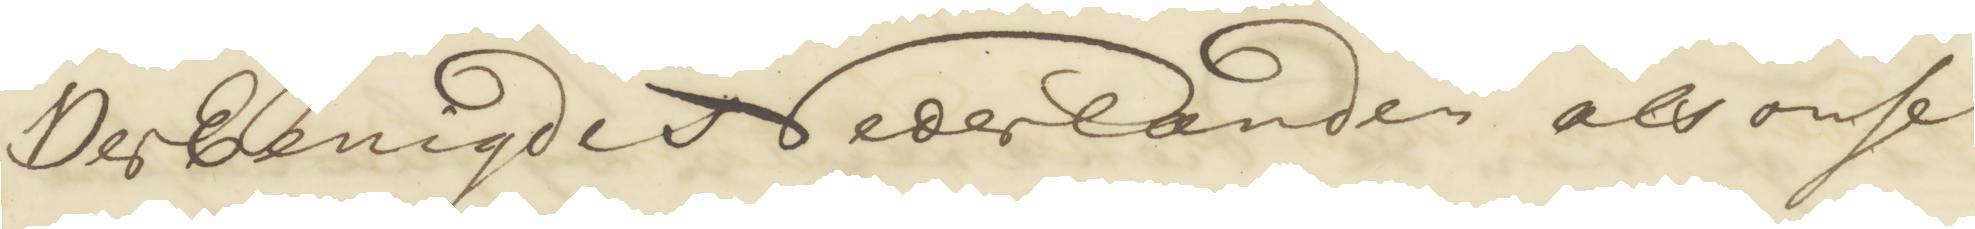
VerEenigde Nederlanden als onse
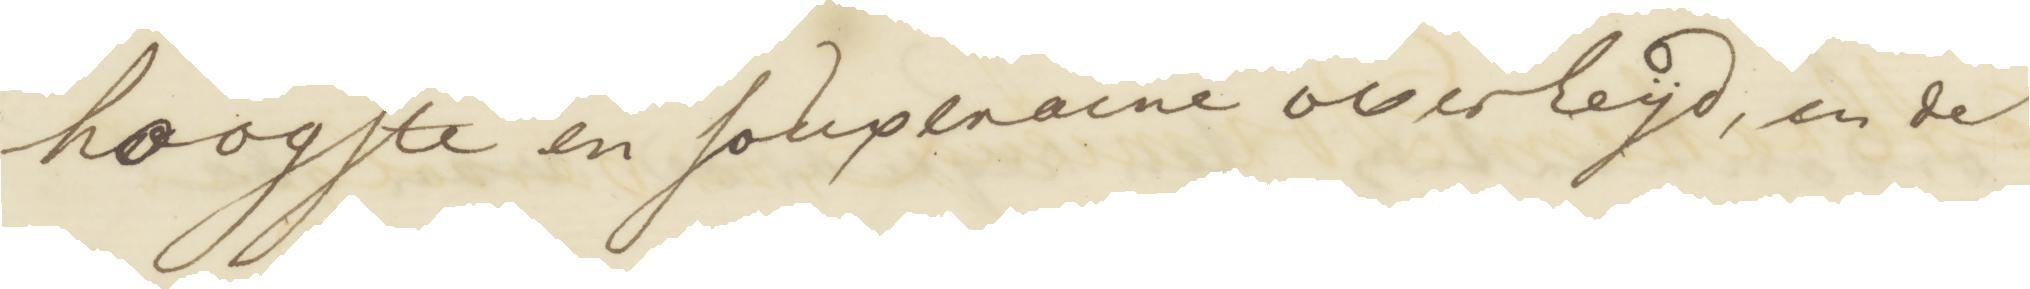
hoogste en souveraine overheijd, en de
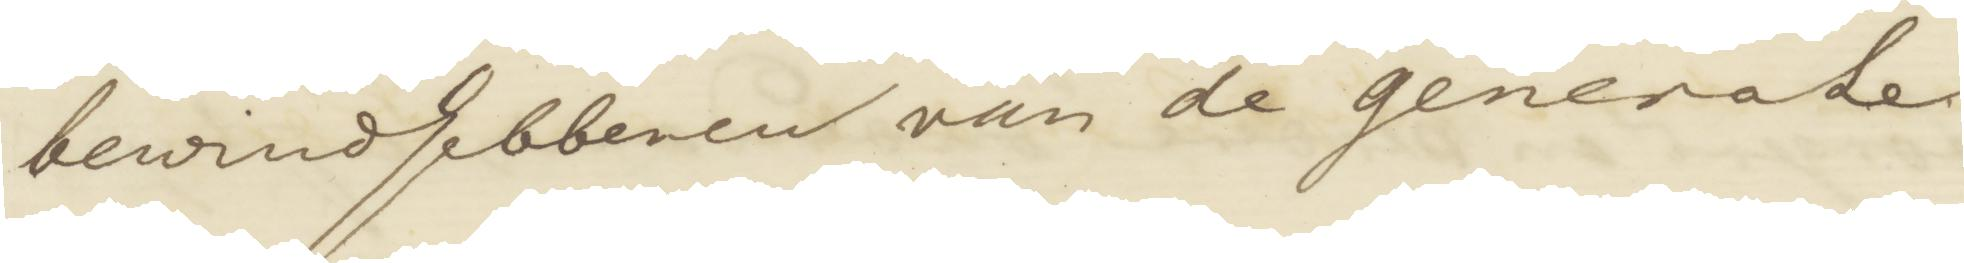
bewindhebberen van de generale
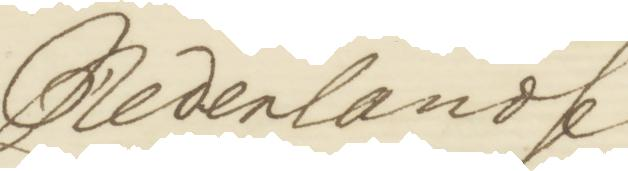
Nederlandse
